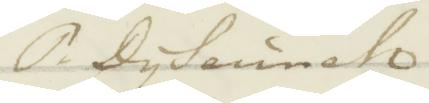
P: Dijserinck
